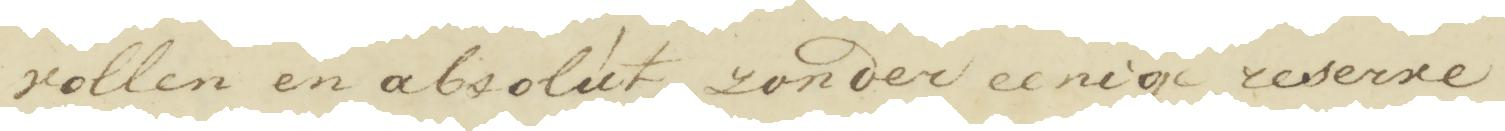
vollen en absolut, zonder eenige reserve
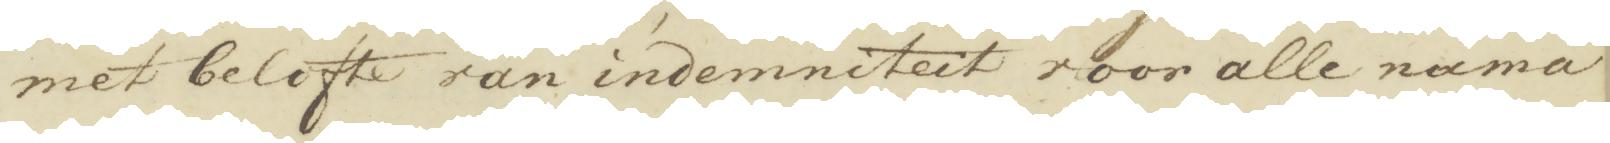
met belofte van indemniteit voor alle nama
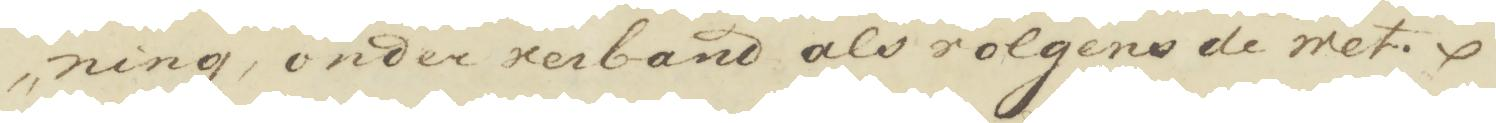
„ning, onder verband als volgens de wet.
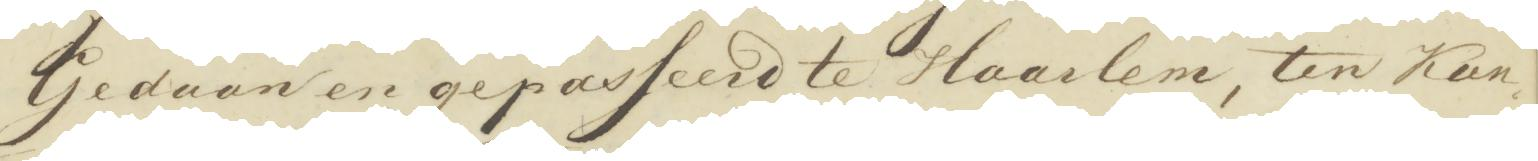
Gedaan en gepasseerd te Haarlem, ten Kan„
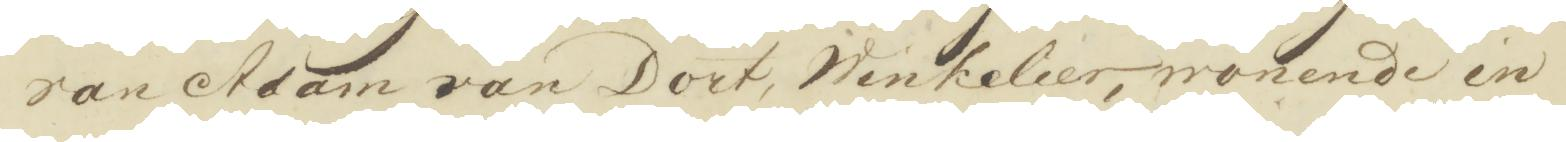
van Adam van Dort, Winkelier, wonende in
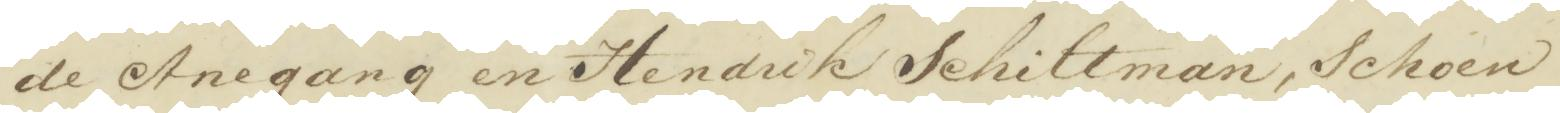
de Anegang en Hendrik Schiltman, Schoen
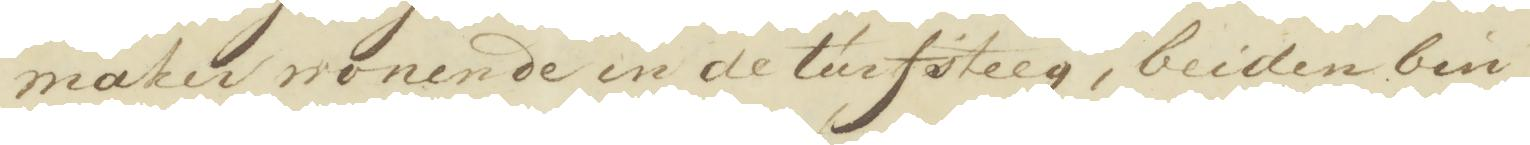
maker wonende in de turfsteeg, beiden bin
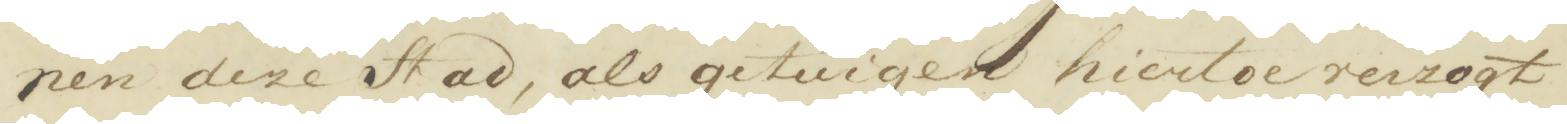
nen deze Stad, als getuigen hiertoe verzogt
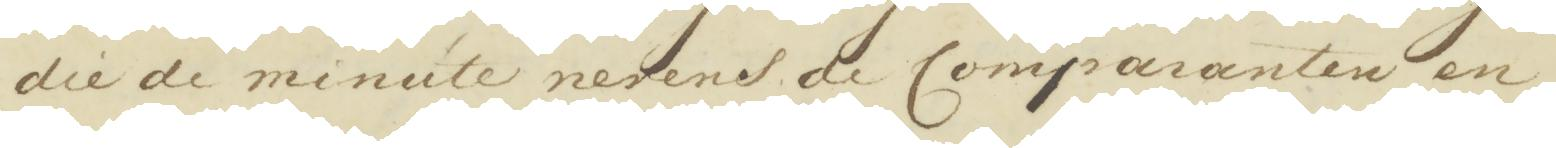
die de minute nevens de Comparanten en
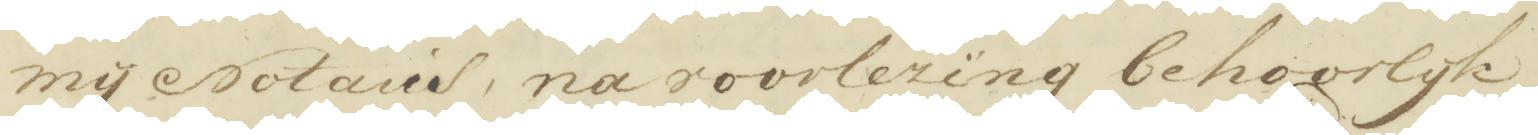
mij Notaris, na voorlezing behoorlijk
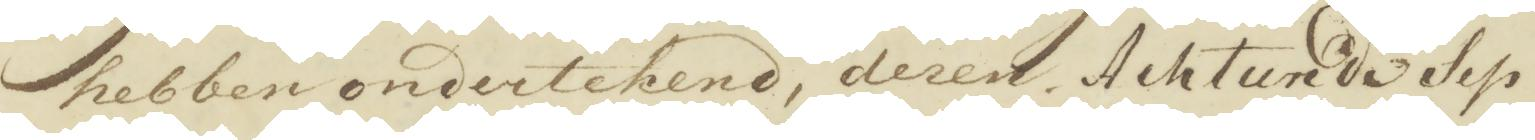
hebben ondertekend, dezen, Achtiende Sep
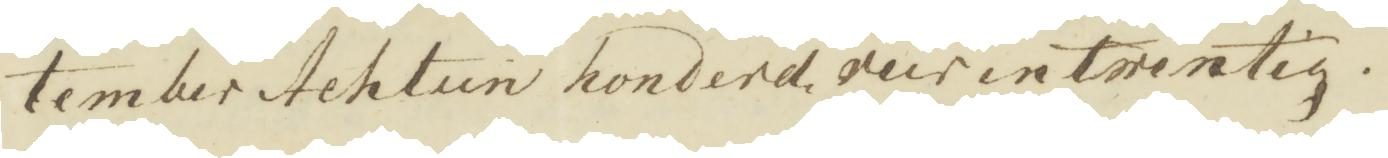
tember Achtien honderd vier en twintig.
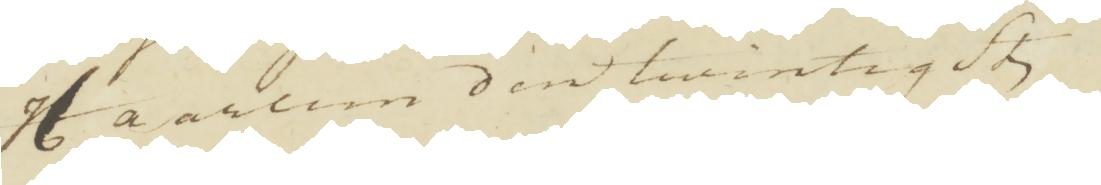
Haarlem den twintigsten
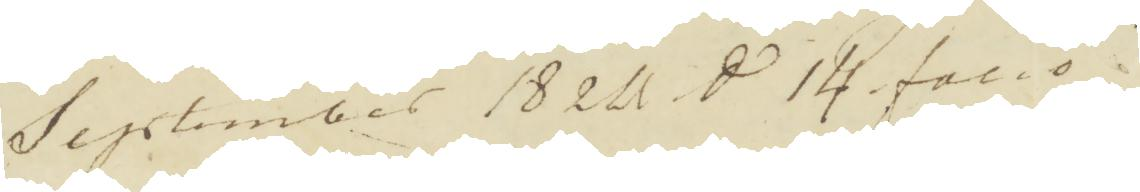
September 1824 d 14. folio
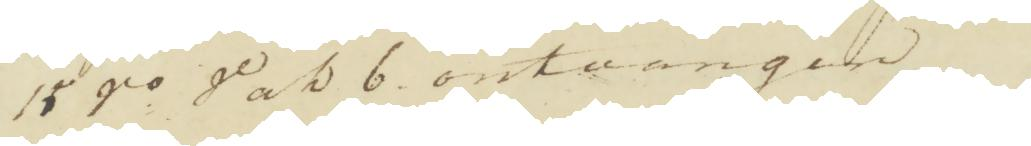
15 V.o Vak 6. ontvangen
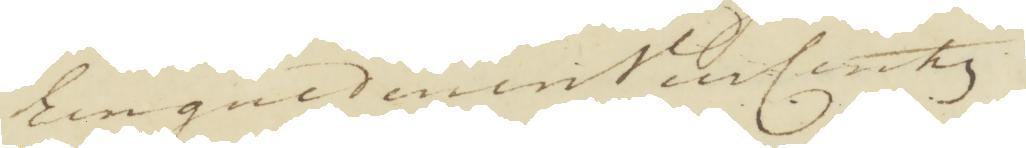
Een guldenenVierCenten
